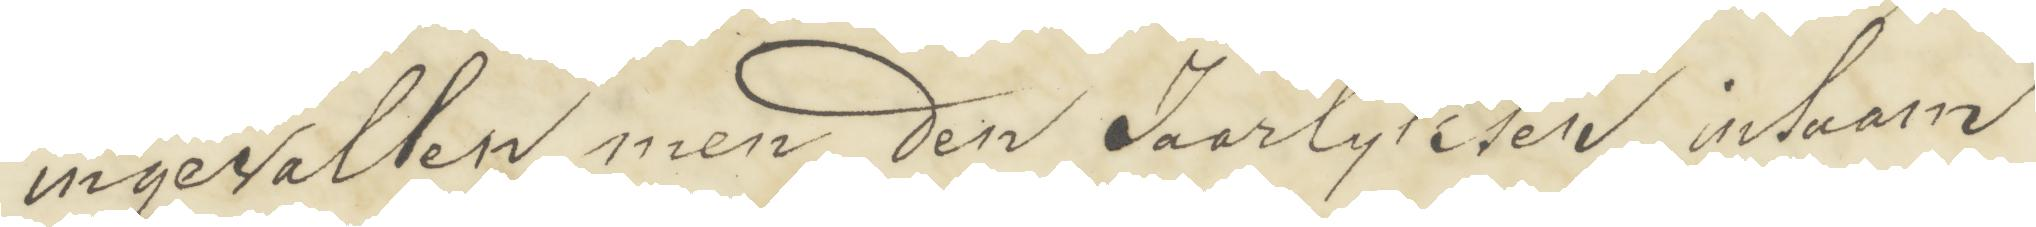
ingevallen men den Jaarlyksen insaam
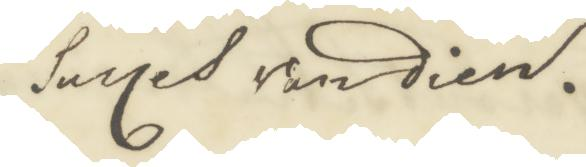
succes van dien.
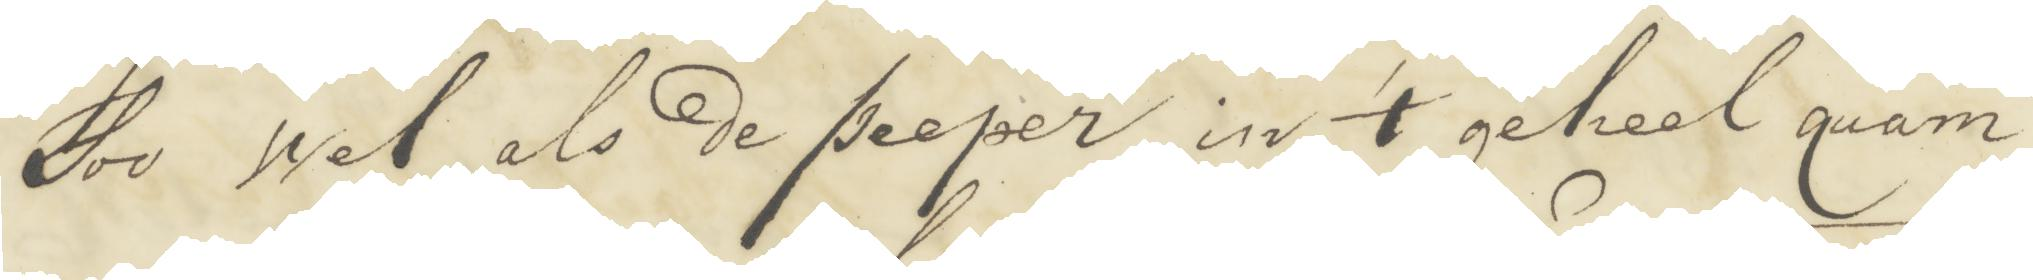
soo wel, als de peeper in ’t geheel quam
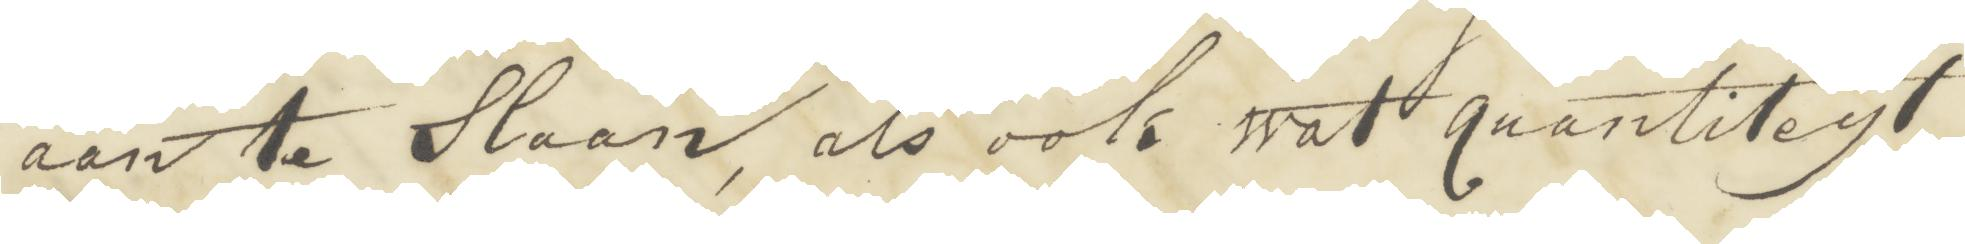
aan te slaan, als ook wat quantiteyt
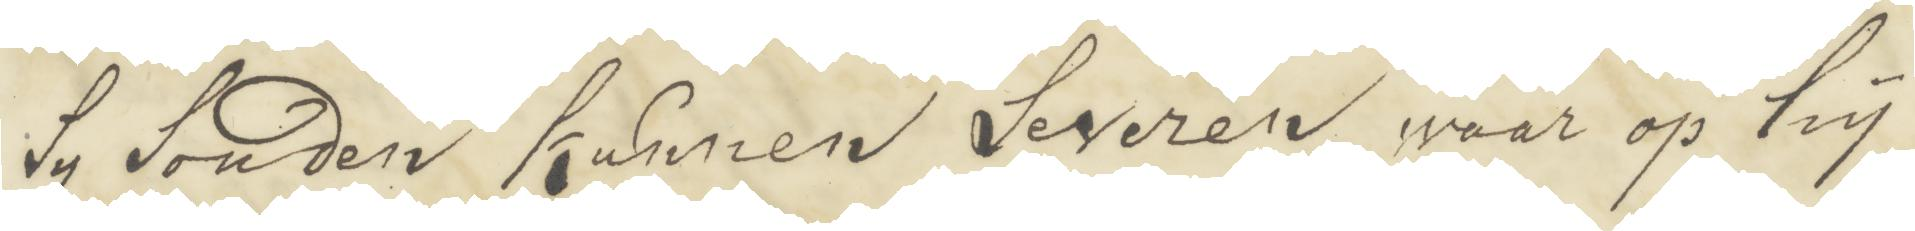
sy souden kunnen leveren, waar op hij
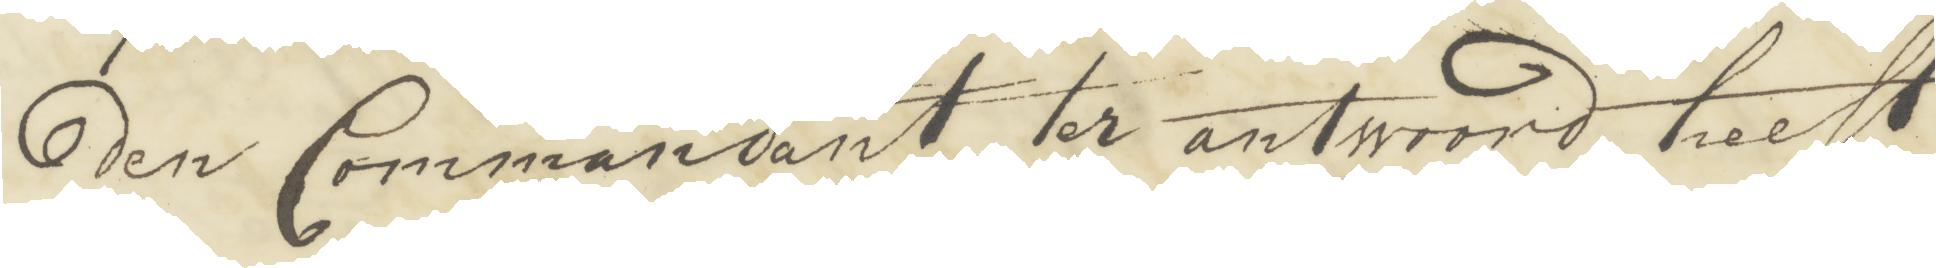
den Commandant ter antwoord heeft
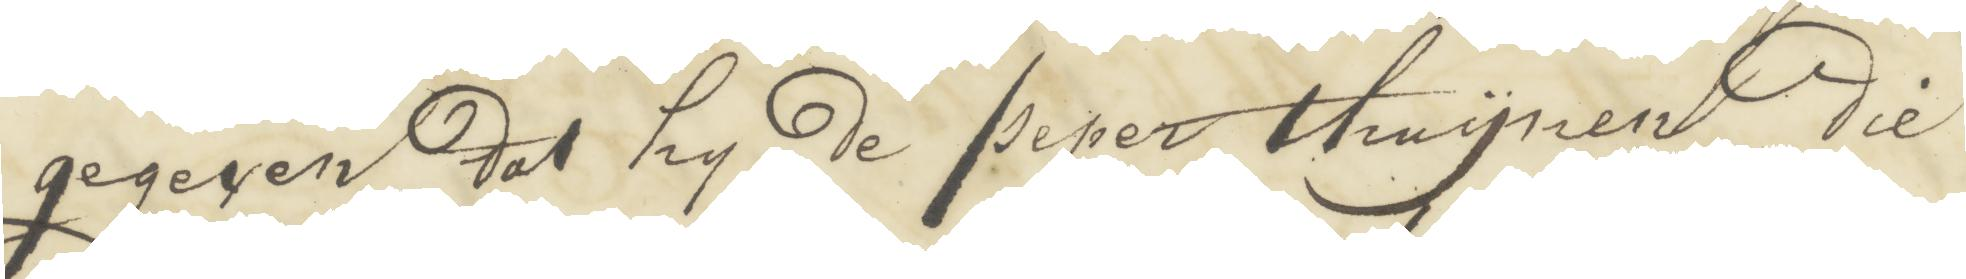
gegeven dat hy de peper thuijnen die
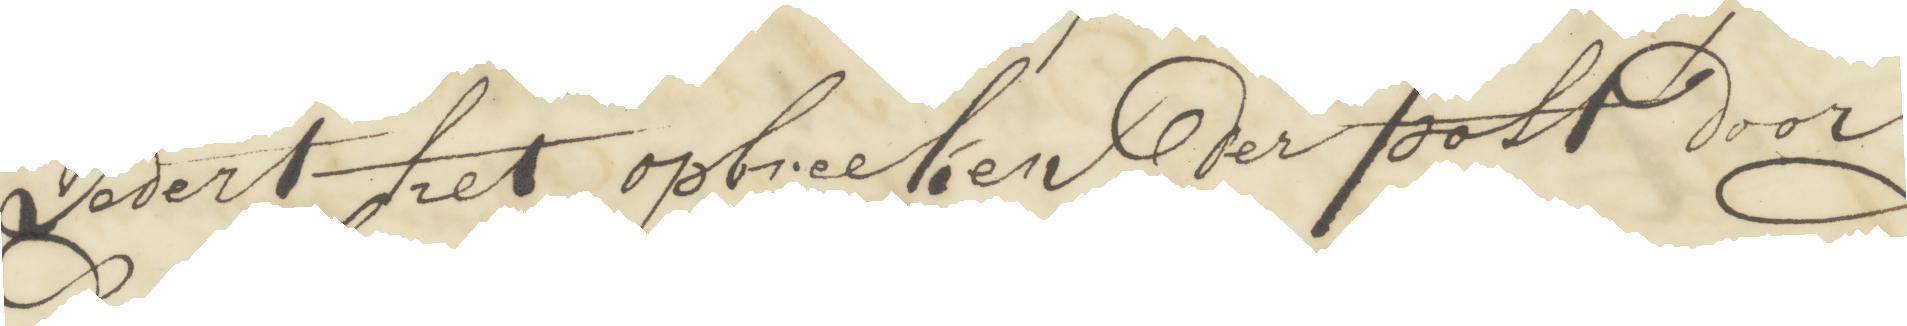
sedert het opbreeken der post door
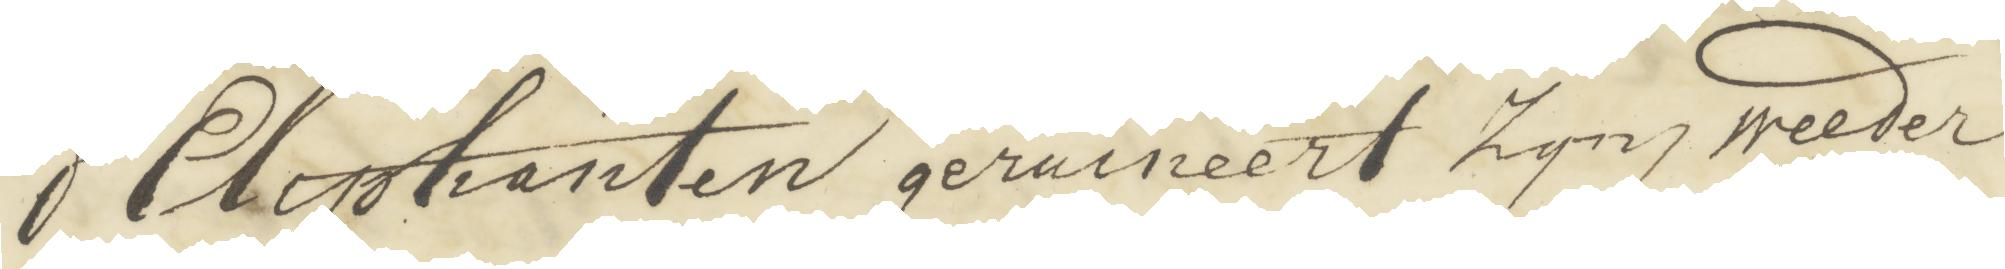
d Eliphanten geruineert zyn, weeder
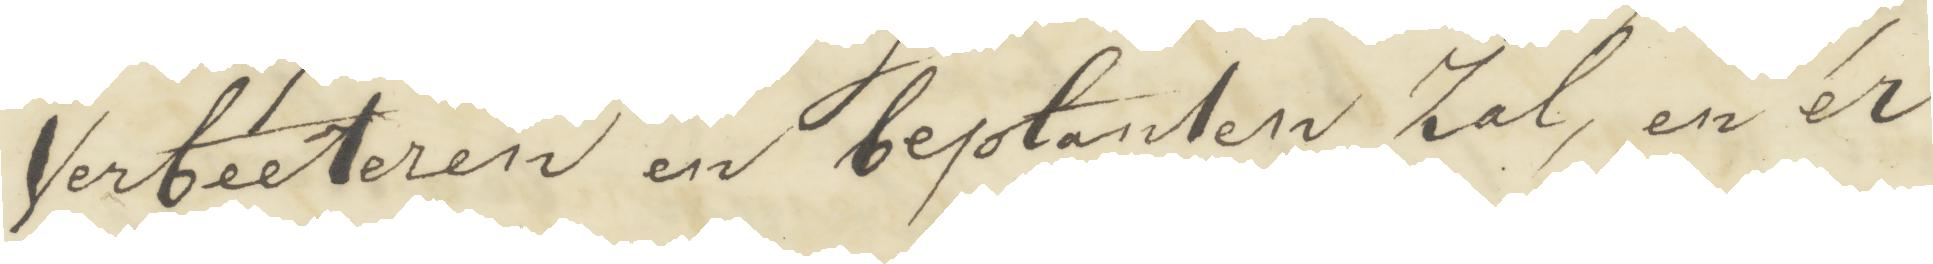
verbeeteren en beplanten zal, en 'er
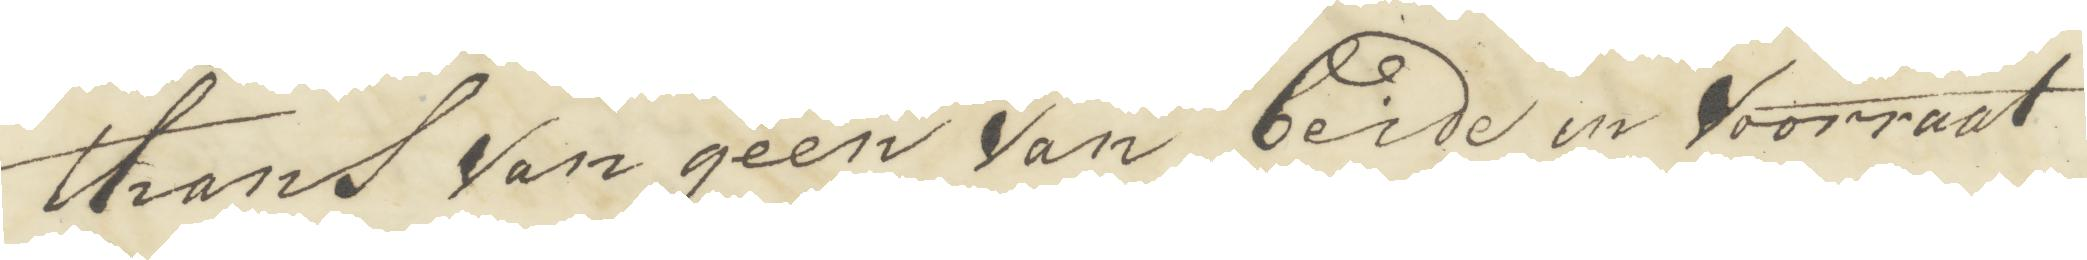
thans van geen van beide in voorraat
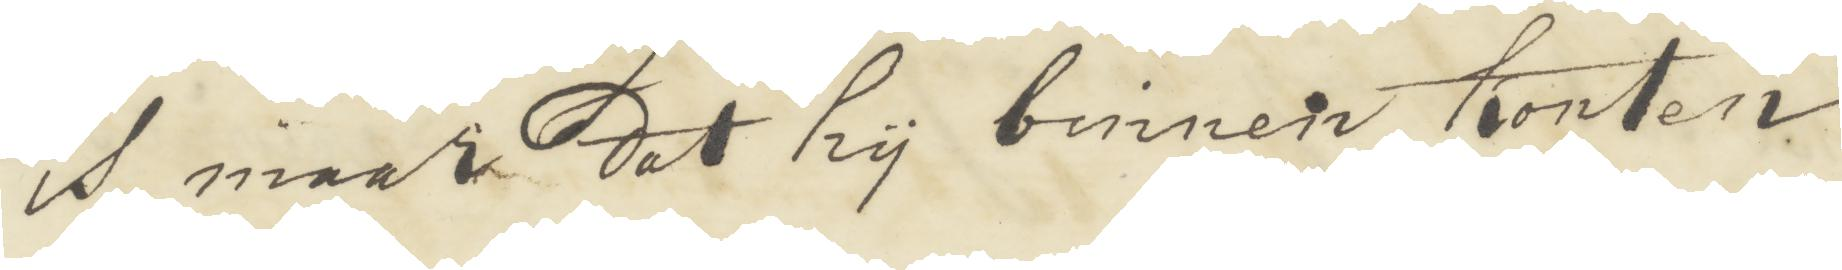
is, maar dat hij binnen korten
